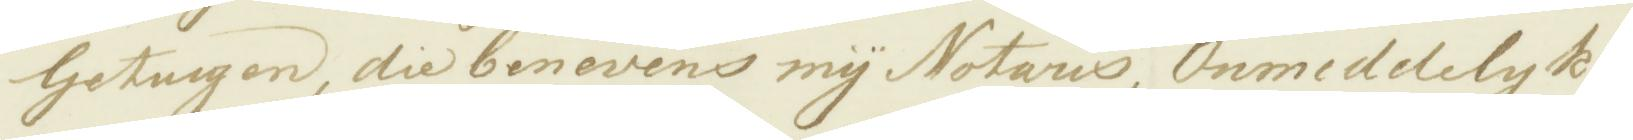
Getuigen, die benevens mij Notaris, Onmiddelyk
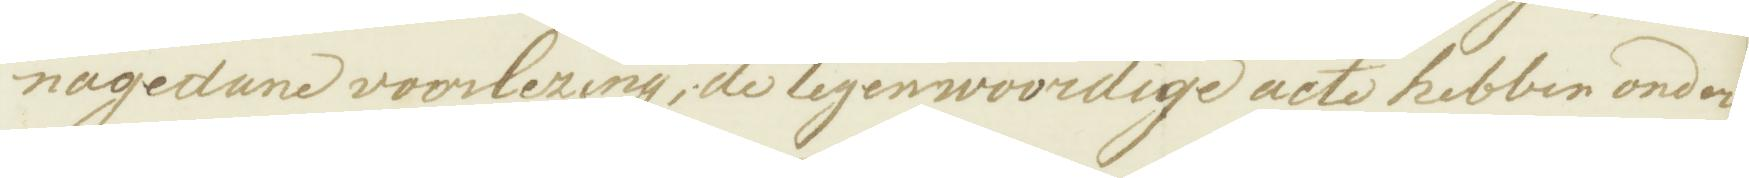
nagedane voorlezing, de tegenwoordige acte hebben onder
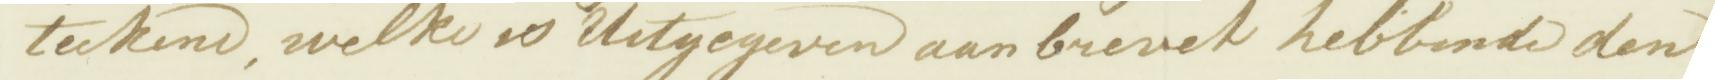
teekend, welke is uitgegeven aan brevet hebbende den
